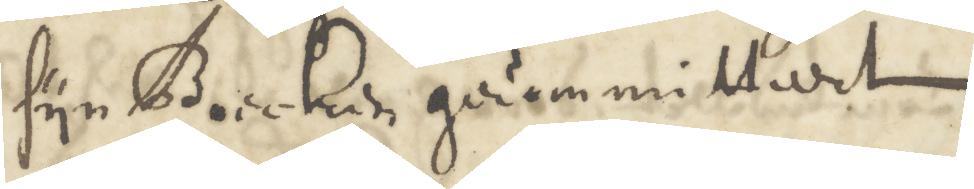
sijn Boecken gecommitteert
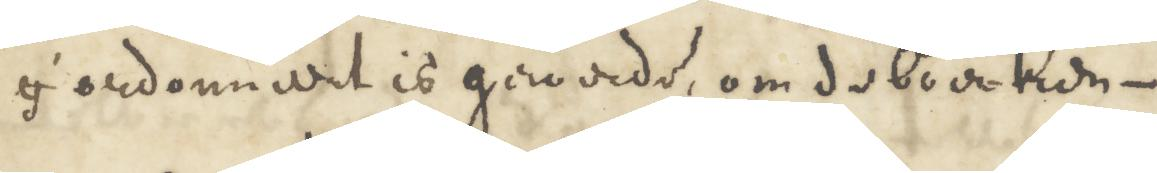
g’ordonneert is gewerde, om de boecken —
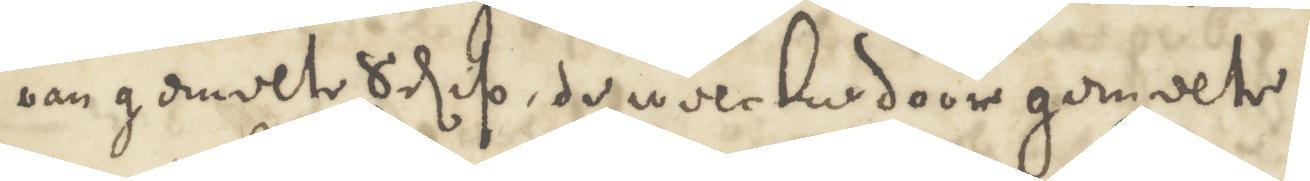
van gemelte Schip, de welcke door gemelte
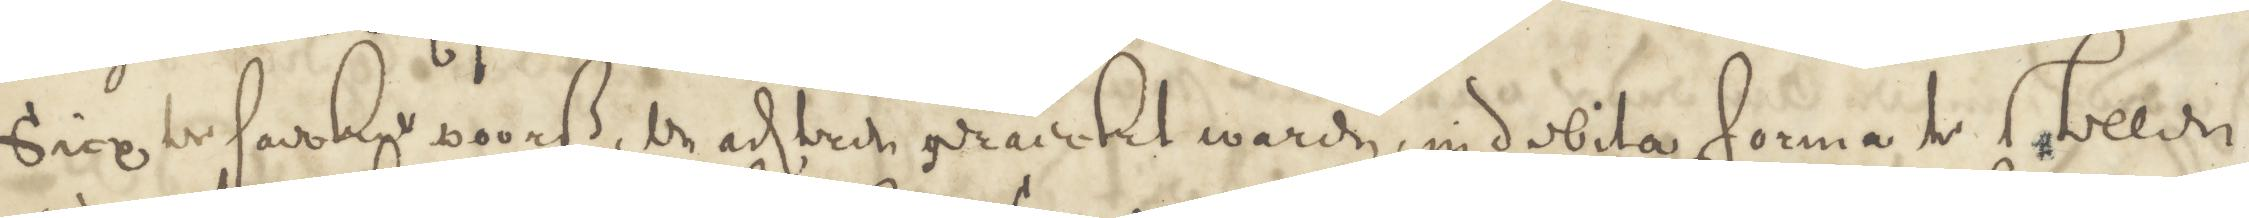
Sicx ter saecke voors, ten achteren geraeckt waren, in debita forma te stellen
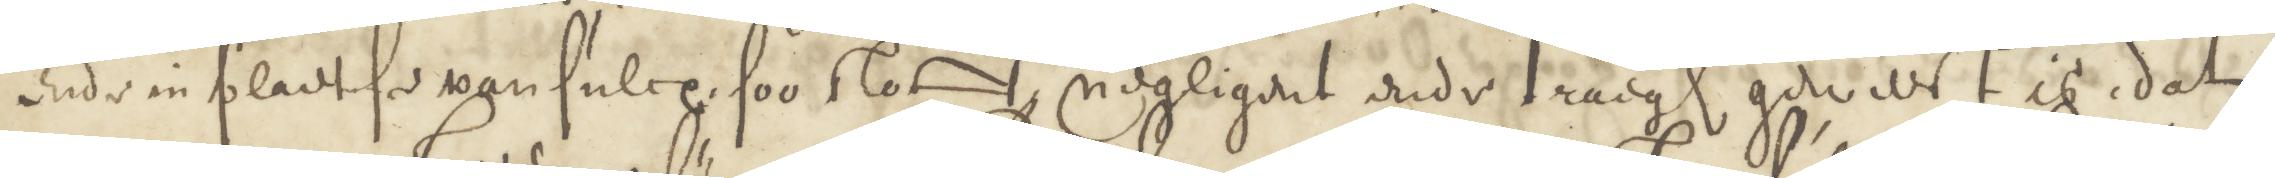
ende in plaetse van sulcx, soo sloff negligent ende traegh geweest is, dat
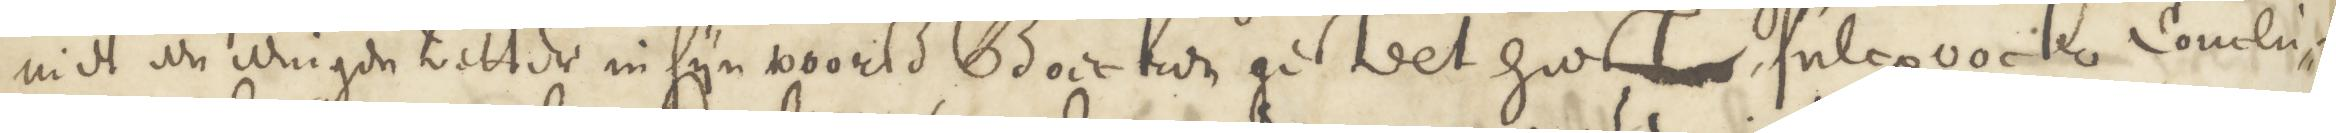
niet een eenigen Letter in sijn voors Boecken gestelt heeft, sulcx oock Conclu„ —
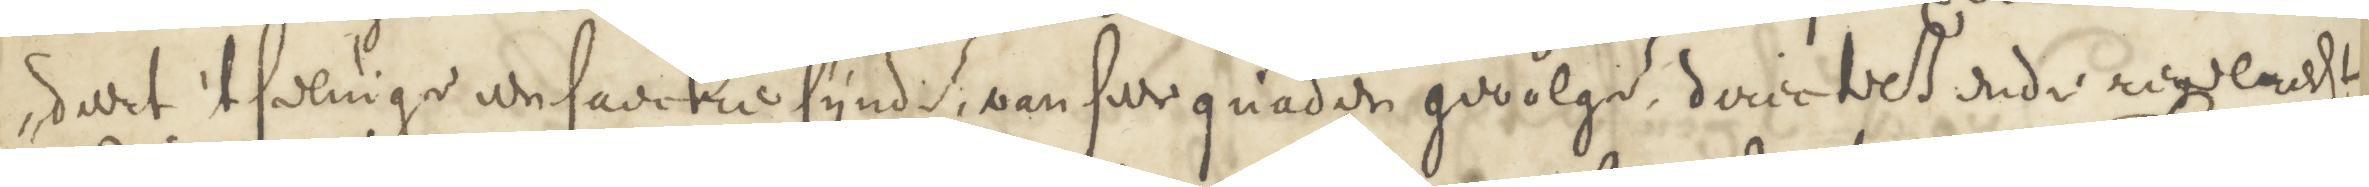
„deert ’t selvige een saecke sijnde, van seer quaden gevolge, directelijk ende regelrecht
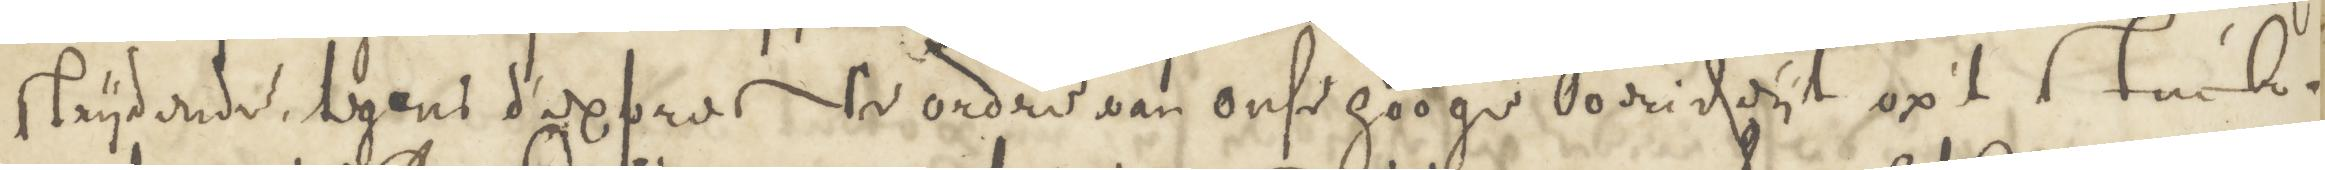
strijdende, tegens d'expresse ordre van onse hooge Overicheijt op ’t stuck —
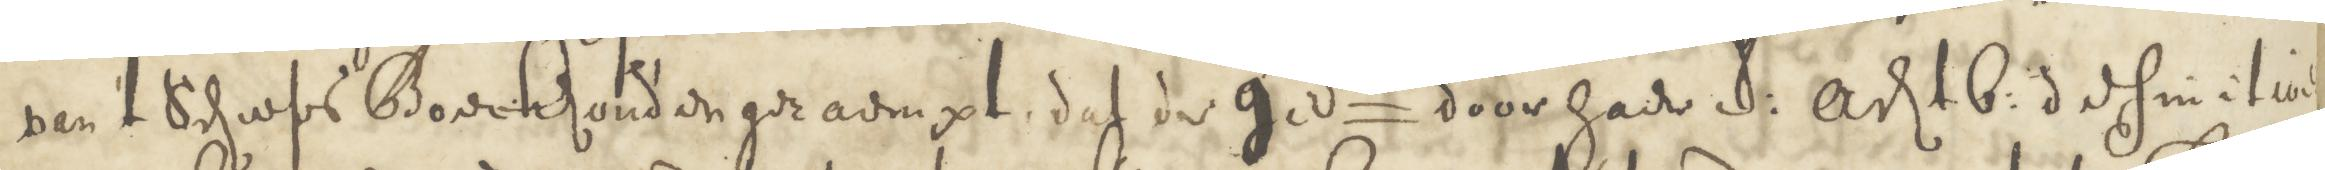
van ’t scheeps Boeckhouden geraempt, dat de ged=e door haer E: achtb: definitive
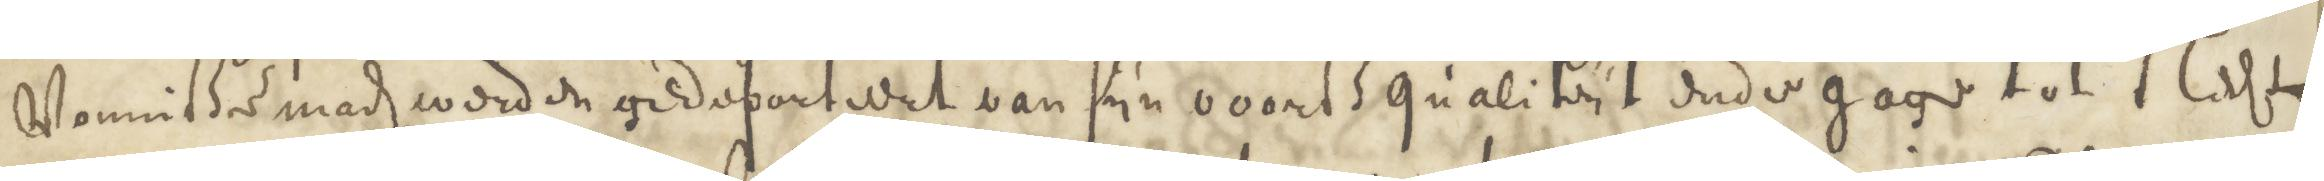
Vonnisse mach werden gedeporteert van sijn voors qualiteijt ende gage tot slecht
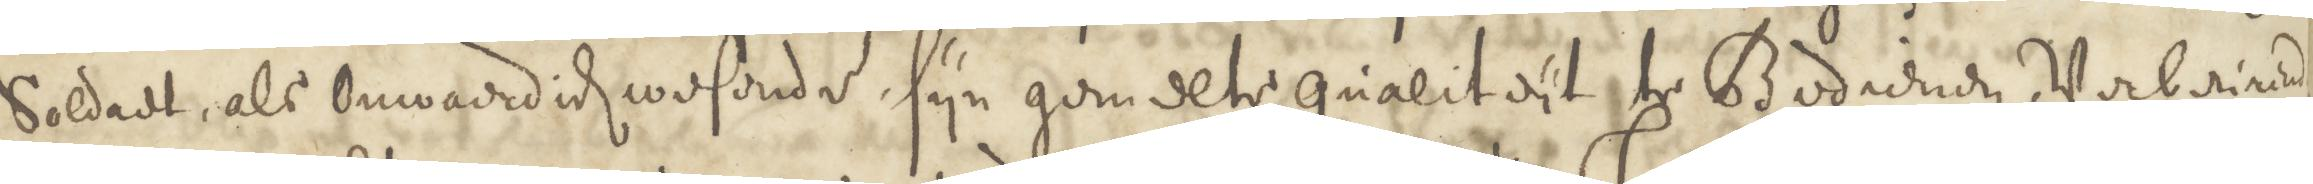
soldaet, als Onwaerdich wesende sijn gemelte qualiteijt te Bedienen, Verbeurend
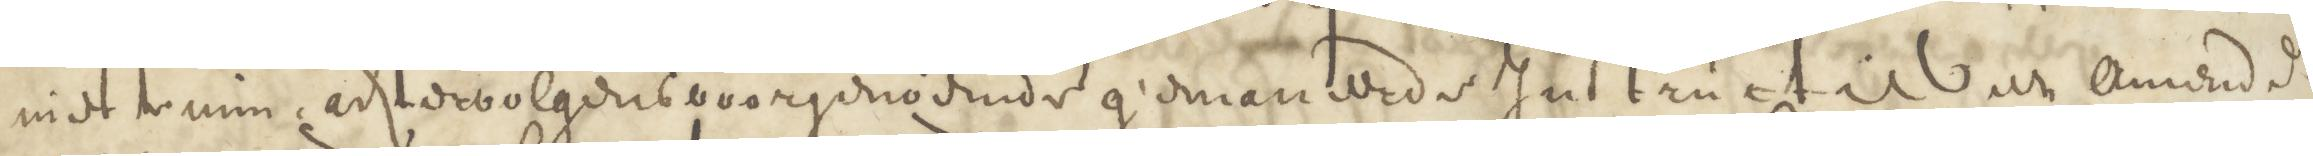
niet te min, achtervolgens voorgenoemde g’emaneerde Jnstructie een amende
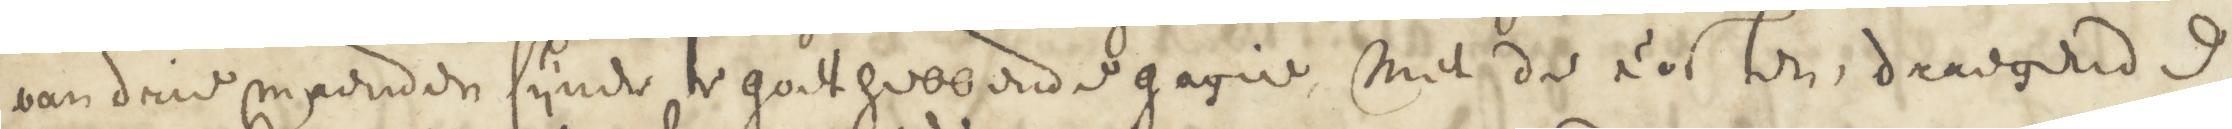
van drie maenden sijner te goet hebbende gagie met de costen, draegende
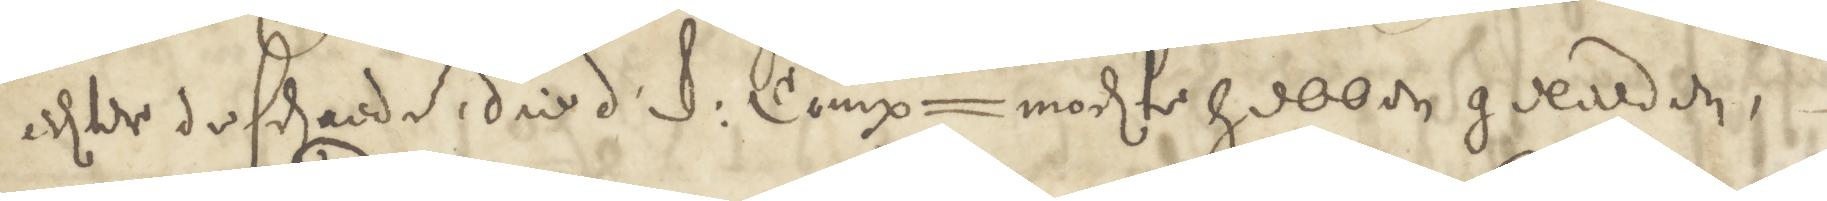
echter de schaede, die d’E: Comp=e mochte hebben geleeden,
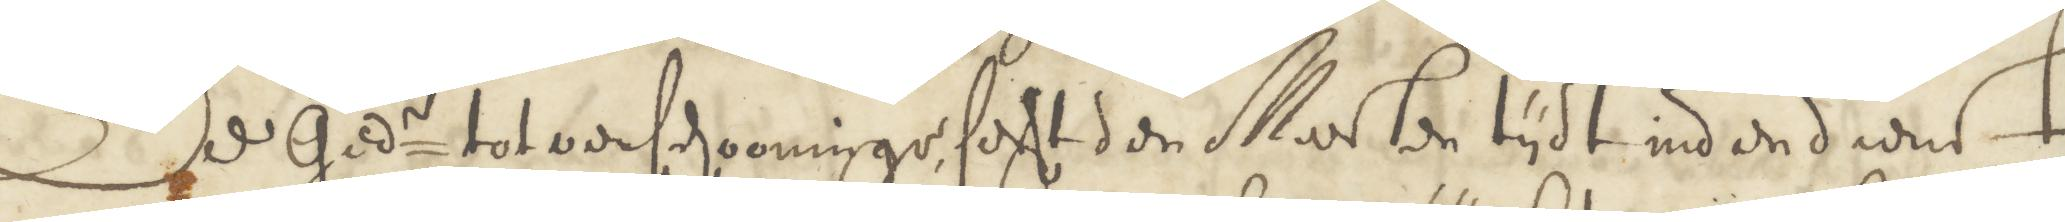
De Ged=e tot verschooninge, secht den Meesten tijdt inden dienst
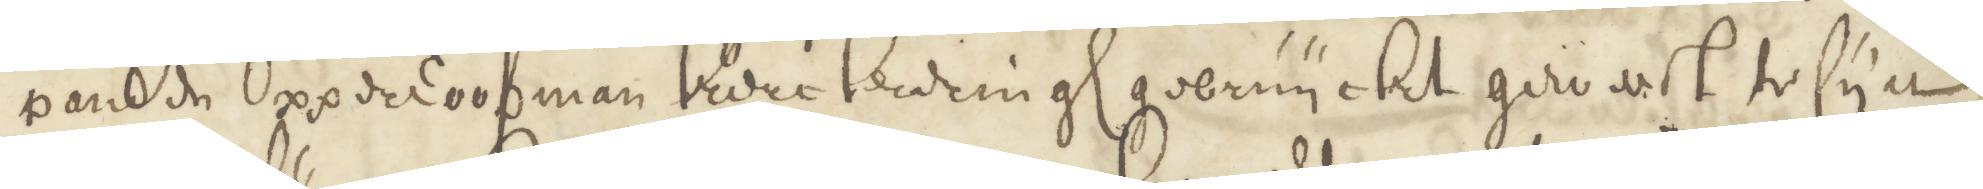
vanden Oppercoopman Kerckeringh gebruijckt geweest te sijn
